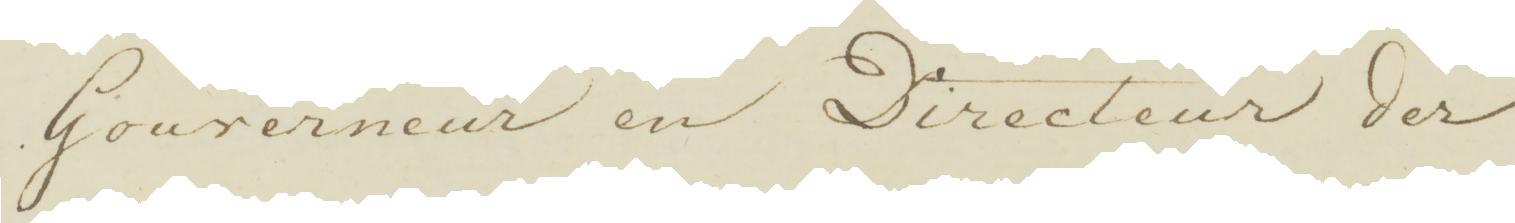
Gouverneur en Directeur der
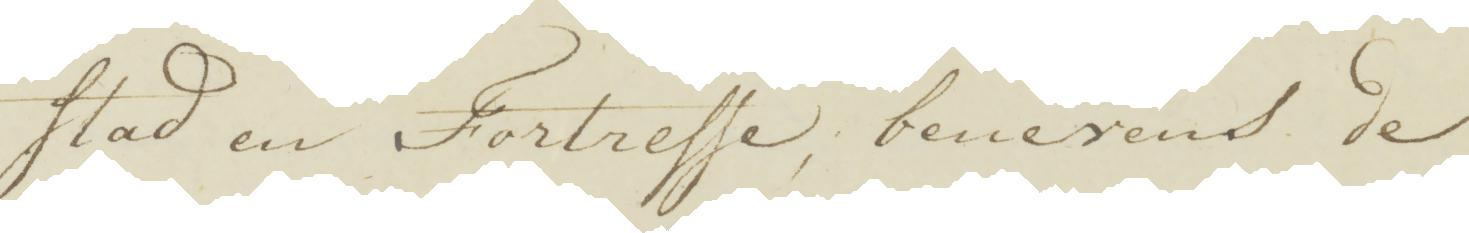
stad en Fortresse, benevens de
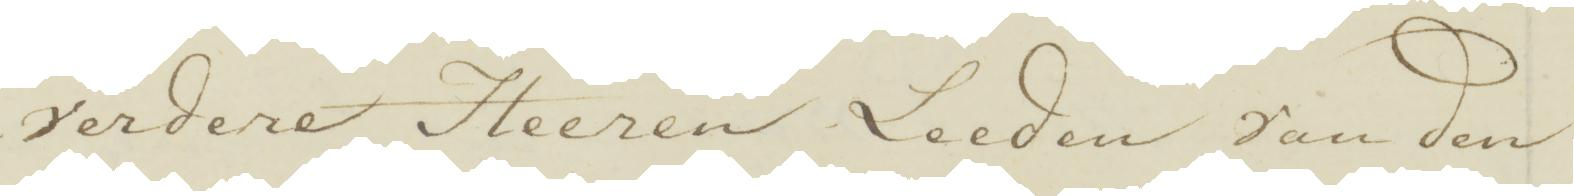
verdere Heeren leeden van den
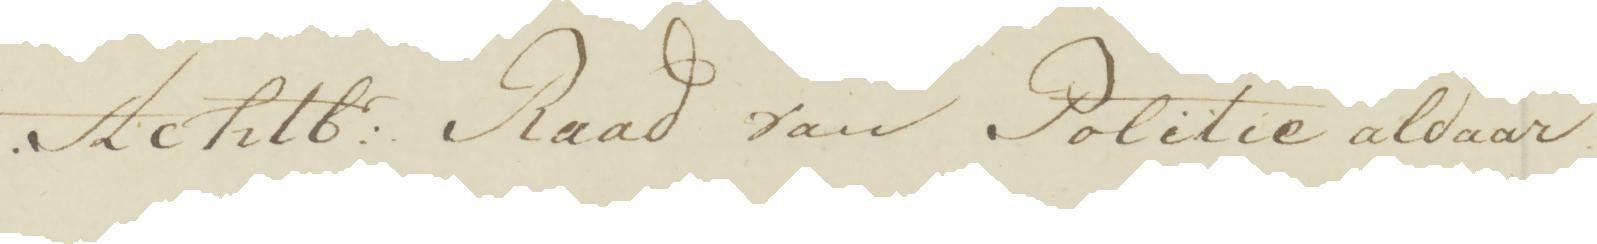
Achtb:r Raad van Politie aldaar
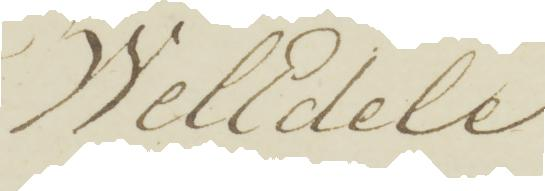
WelEdele
